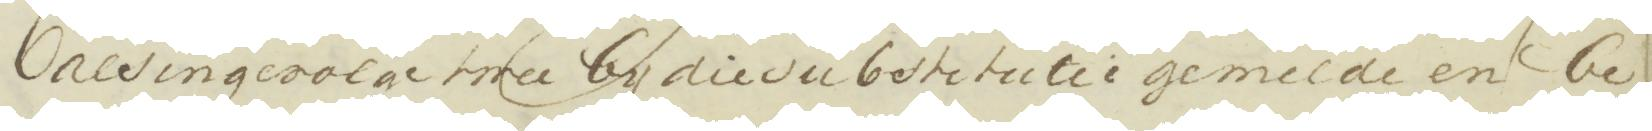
als ingevolge twee by die substitutie gemelde en be
